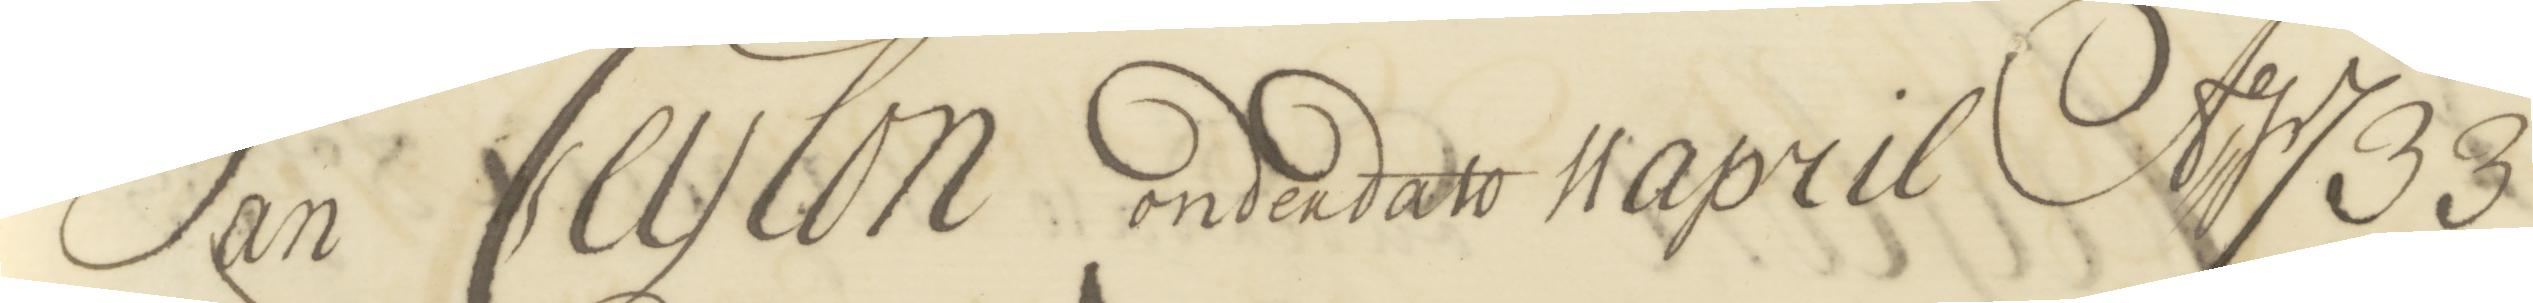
Van Ceylon onder dato 11 april A„o 1733
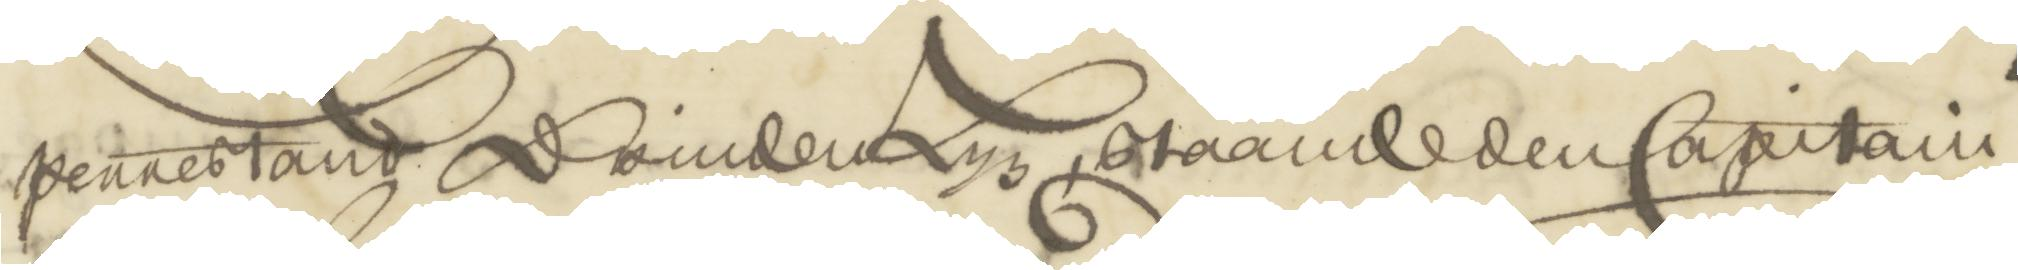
per restand te vinden Zyn staande den Capitain
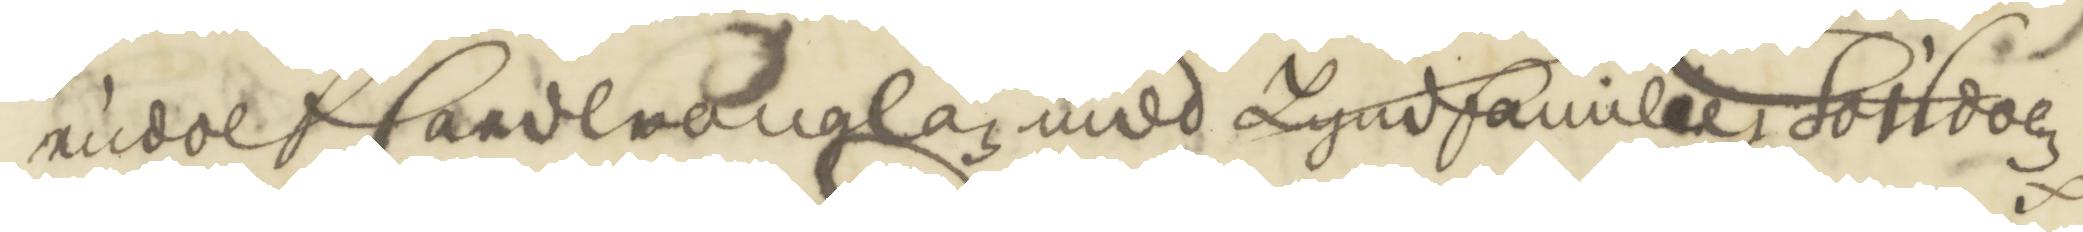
rudolf Carel vanglan med Zyne familie, tot'tdoen
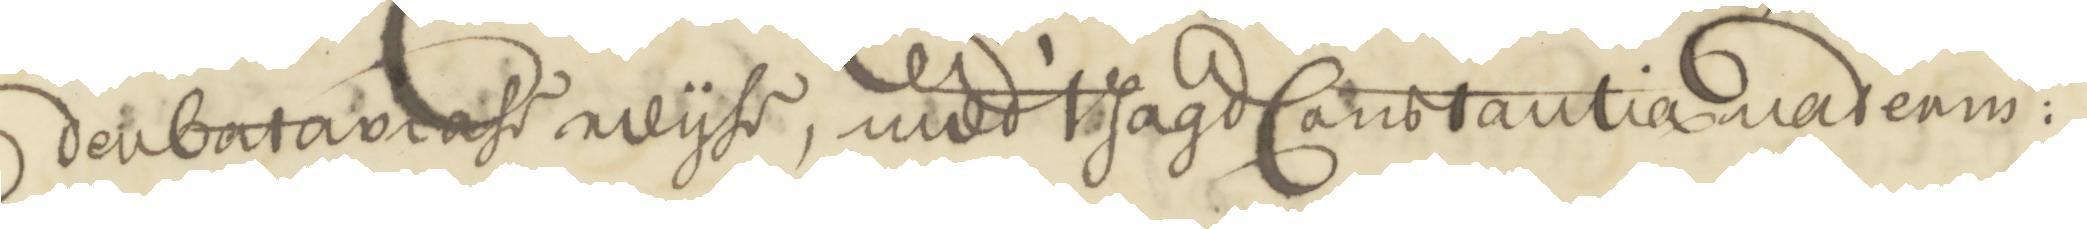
den bataviase reijse, med 't Jagd Constantia na derw:s
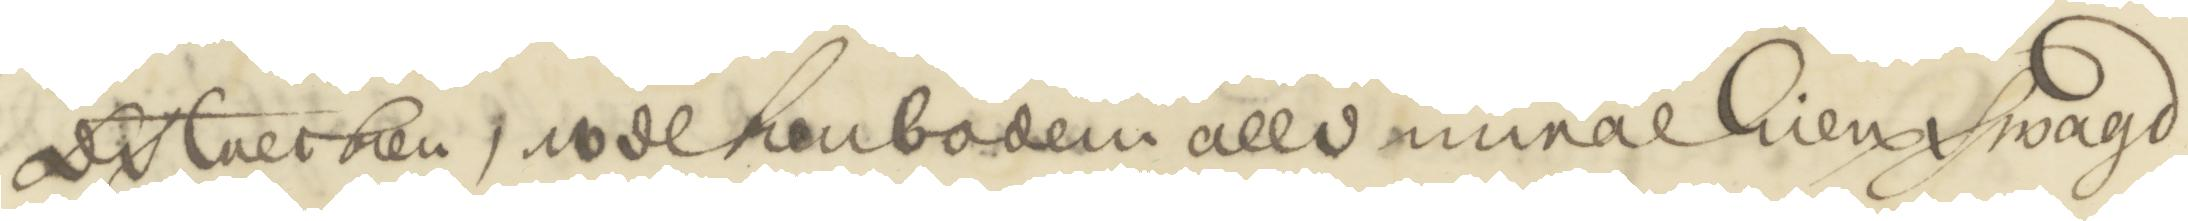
tevertrecken, welken bodem alle uur al hier verwagd
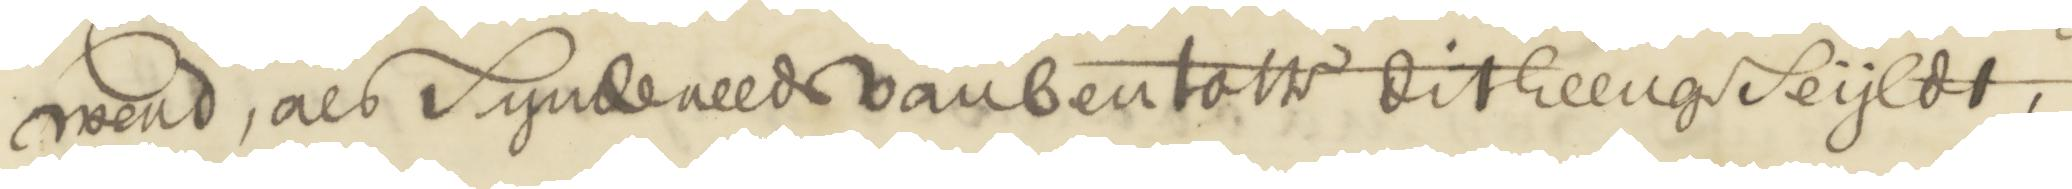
werd, als Synde reeds van bentotte dit heen geseijldt,
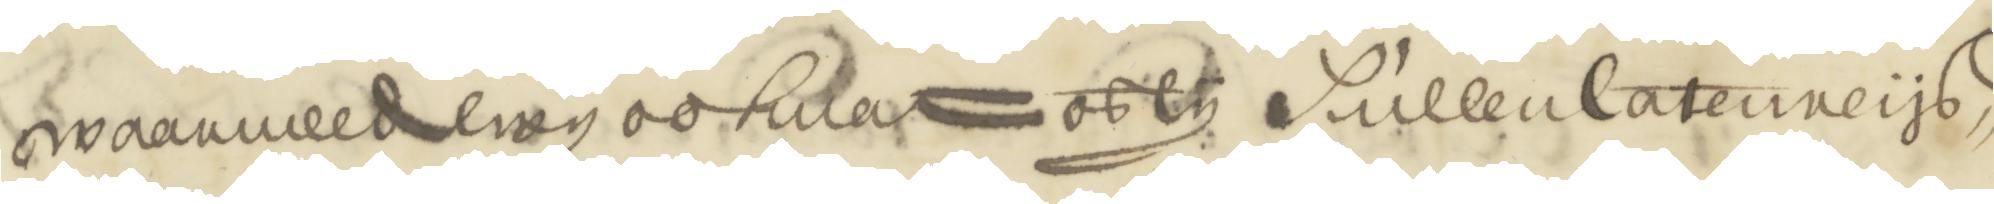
waarmeede wy ook na Costij Sullen laten reijs„
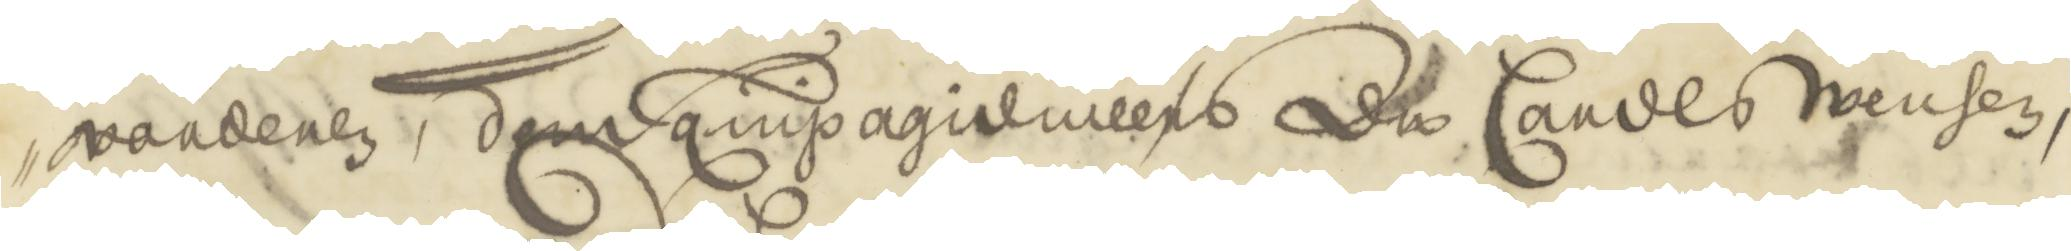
„vorderen, den Equipagiemeerster Carels Wensen,
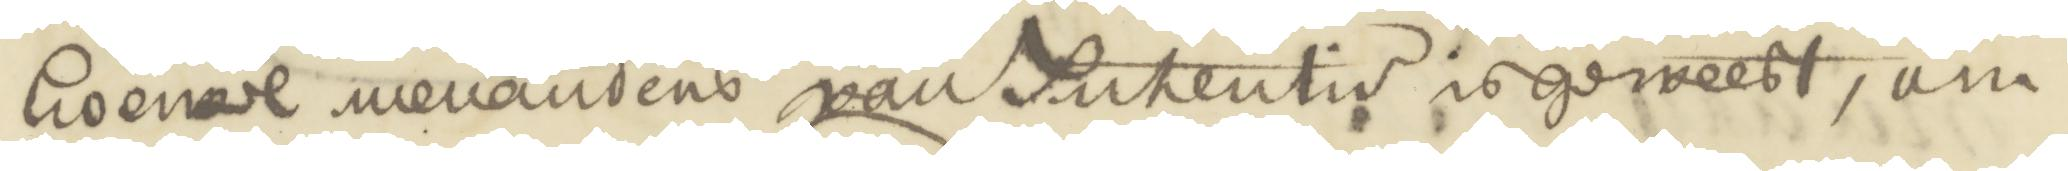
hoewel men anders van Intentie is geweest, om
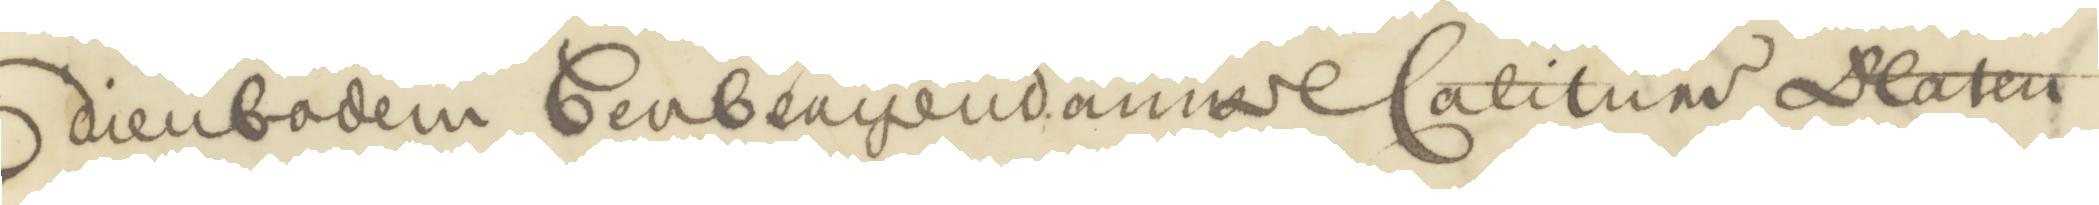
dien bodem berberijen danwel Caliture telaten
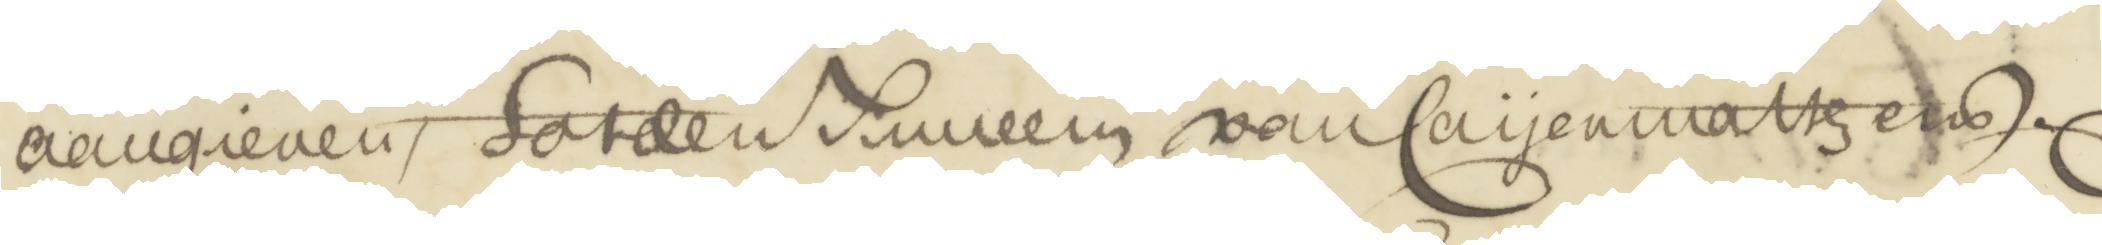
aangieren, tot den Inneem van Caijermatten ens.
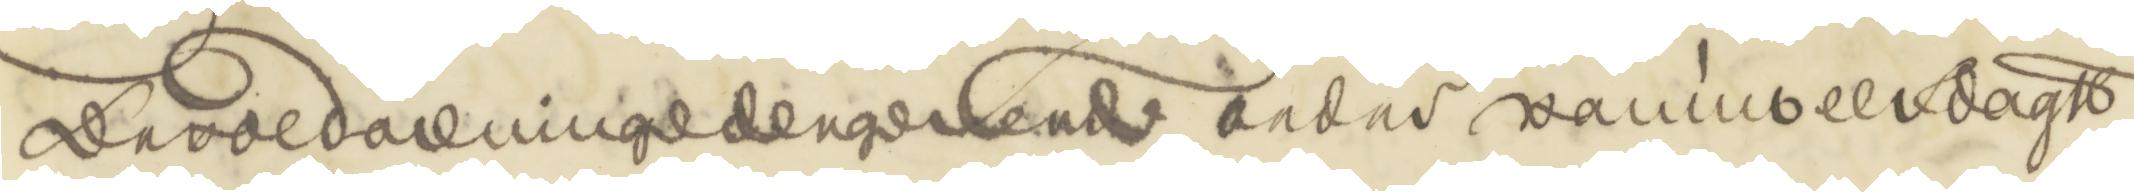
ter voldoeninge der geeerde ordre van uwel Ed agtb
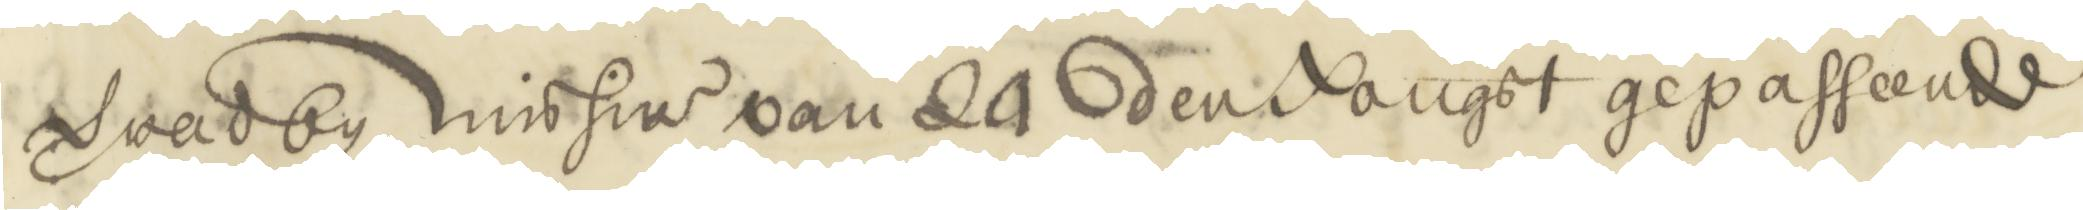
vervad by missive van 24 der Iongst gepasseerde
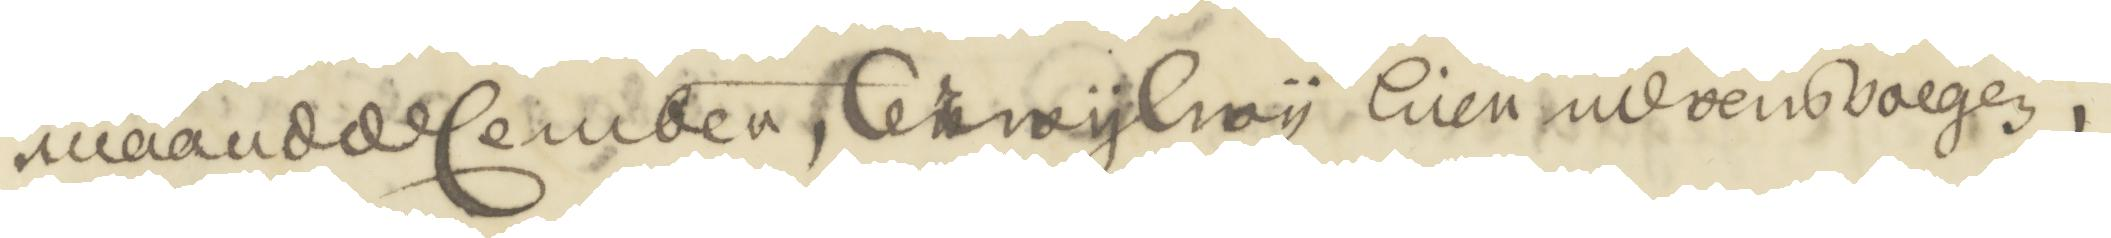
maand december, terwijl wij hier nevens voegen,
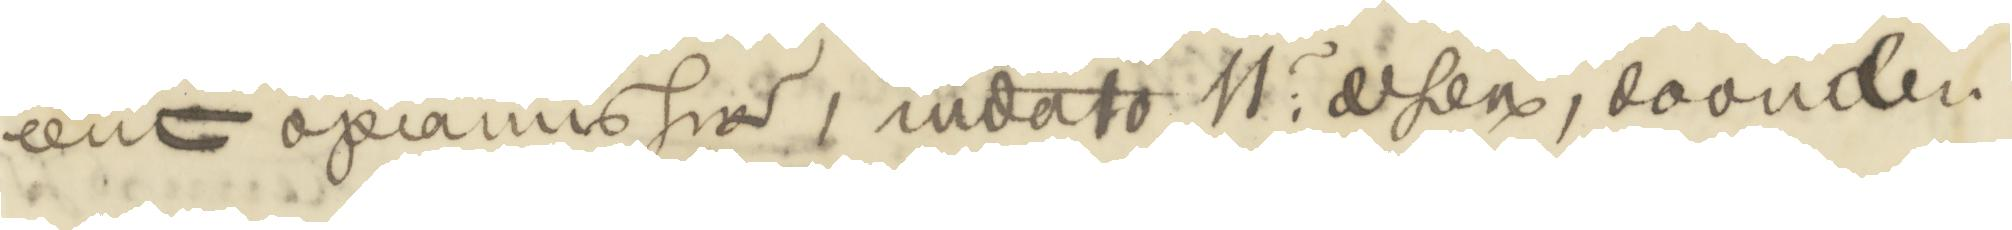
een Copia missive, indato 11:e deser, door den
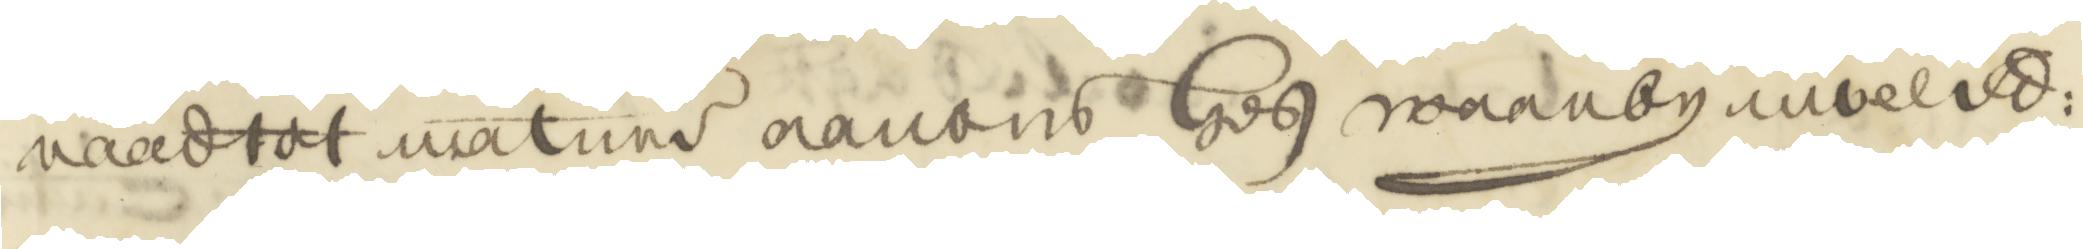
raad tot mature aan ons Ges waarby uwel Ed:
